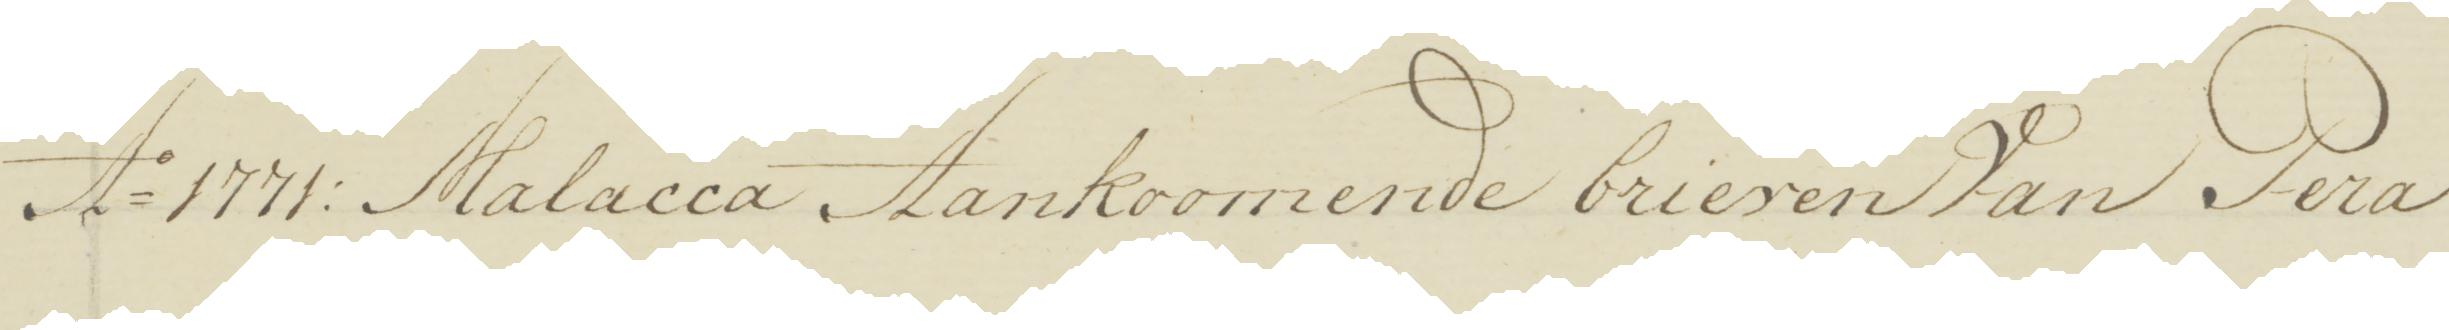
A=o 1711: Malacca Aankoomende brieven van Pera
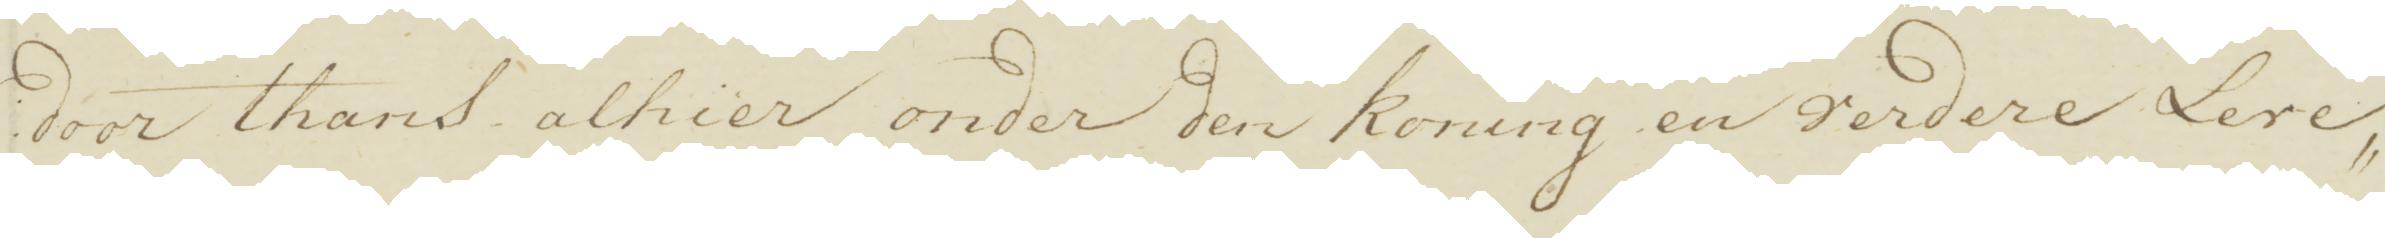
door thans alhier onder den koning en verdere Leve
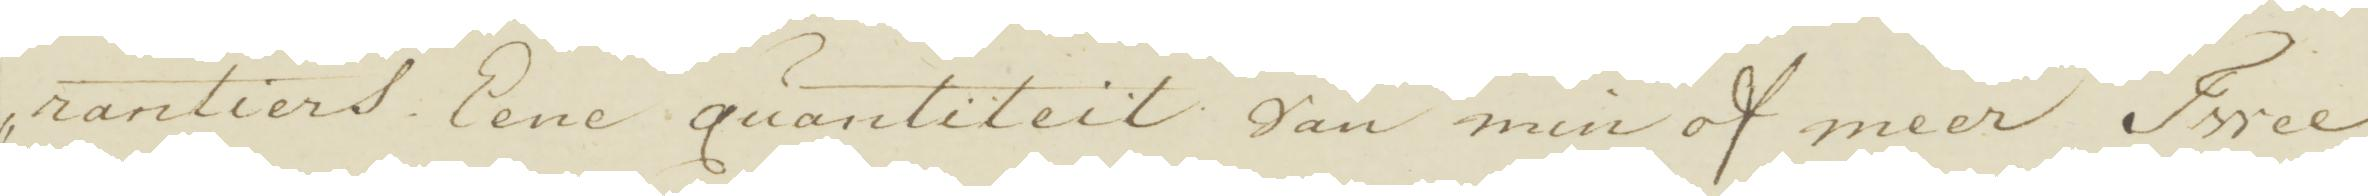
rantiers. Eene quantiteit van min of meer Twee
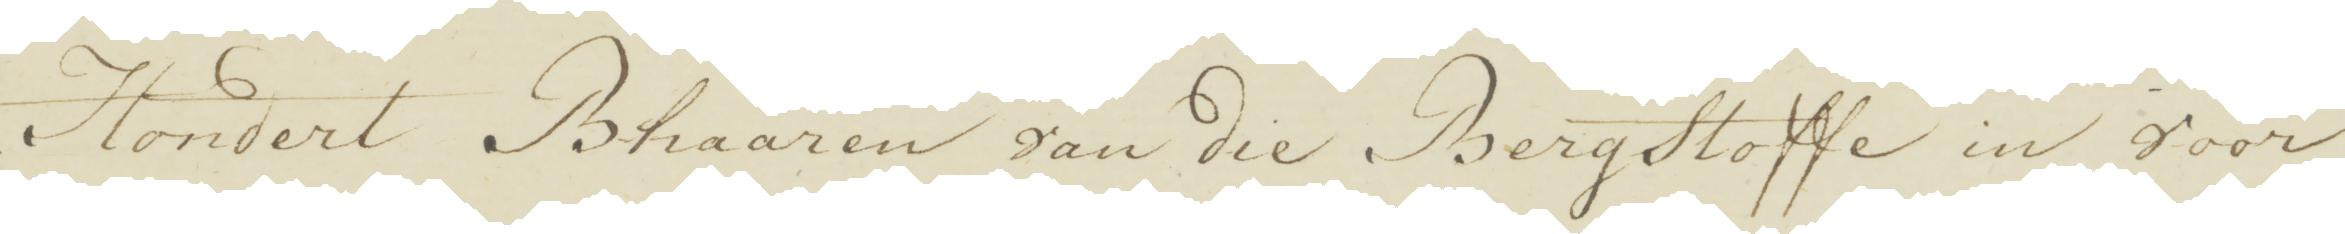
Hondert Bhaaren van die Bergstoffe in voor
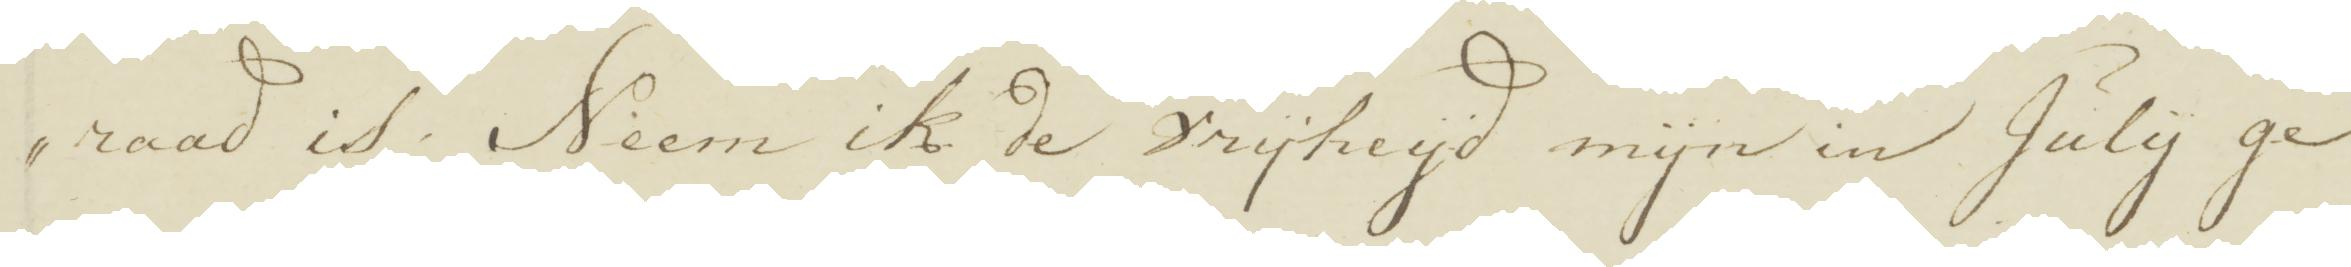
„raad is: Neem ik de vrijheijd mijn in Julij ge
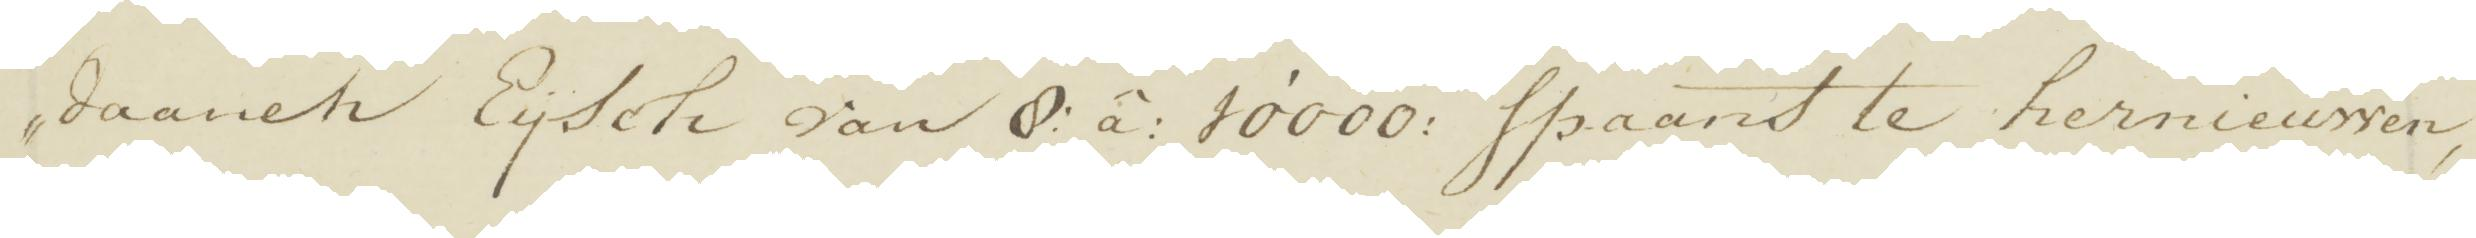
„daanen Eijsch van 8: â: 10'000: spaans te hernieuwen,
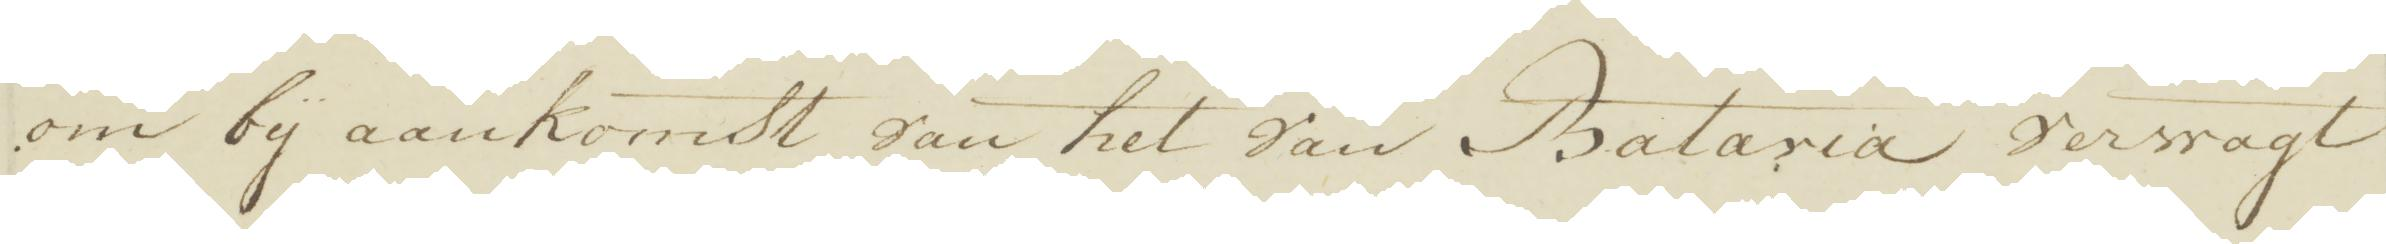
om bij aankomst van het van Batavia verwagt
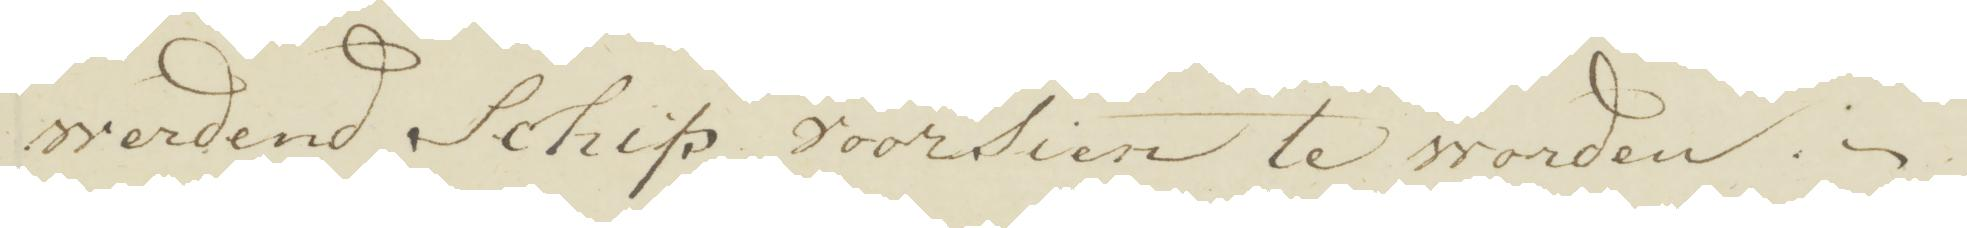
werdend schip voorsien te worden.
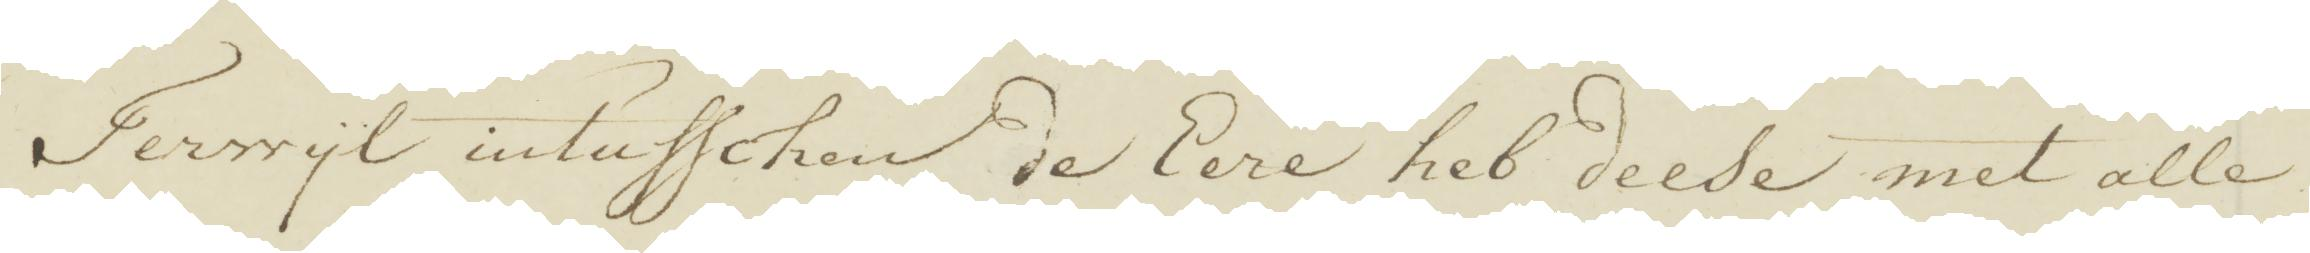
Terwijl intusschen de Eere heb deese met alle
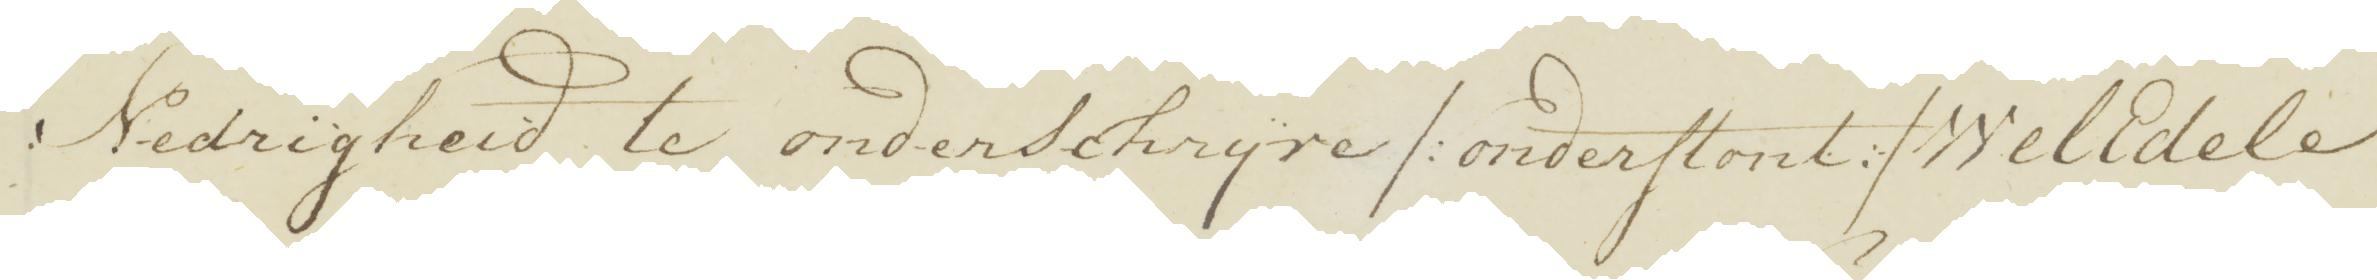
Nedrigheid te onderschrijve /:onderstont:/ Wel Edele
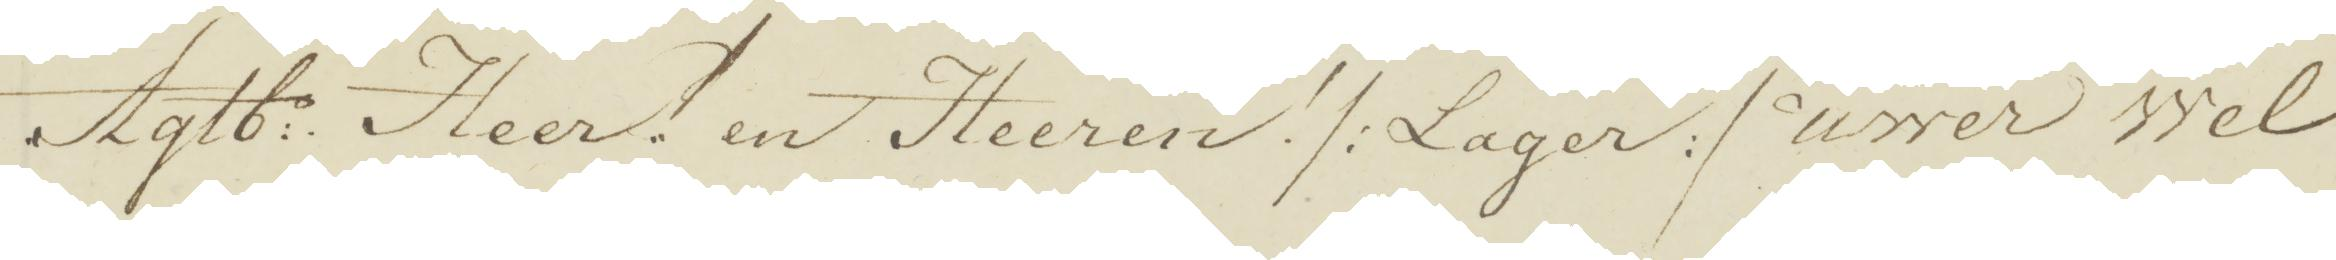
Agtb:r Heer! en Heeren! /:Lager:/ uwer wel
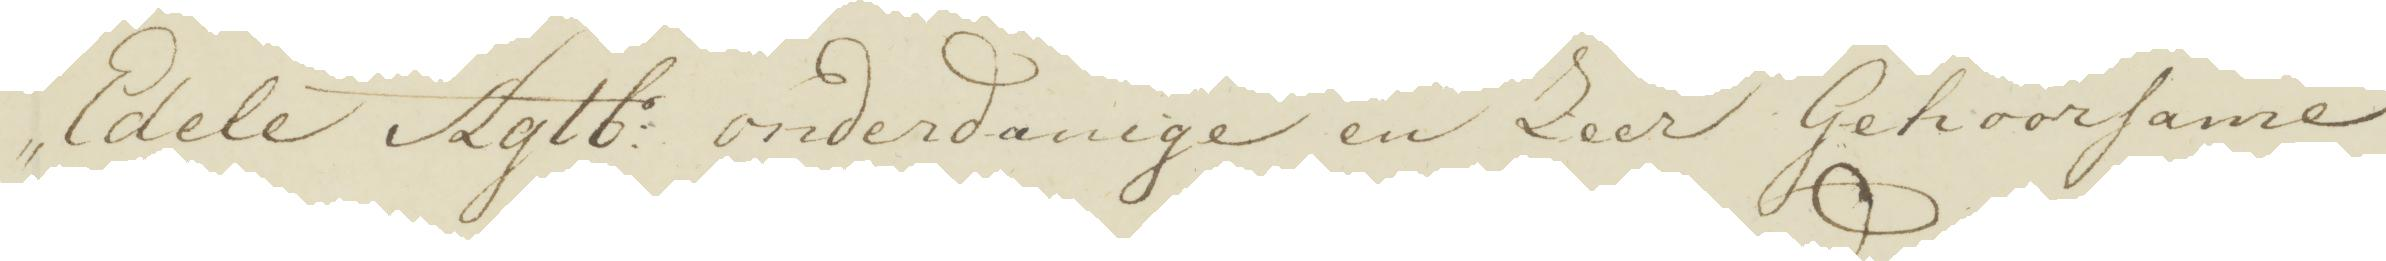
„Edele Agtb:r onderdanige en zeer Gehoorsame
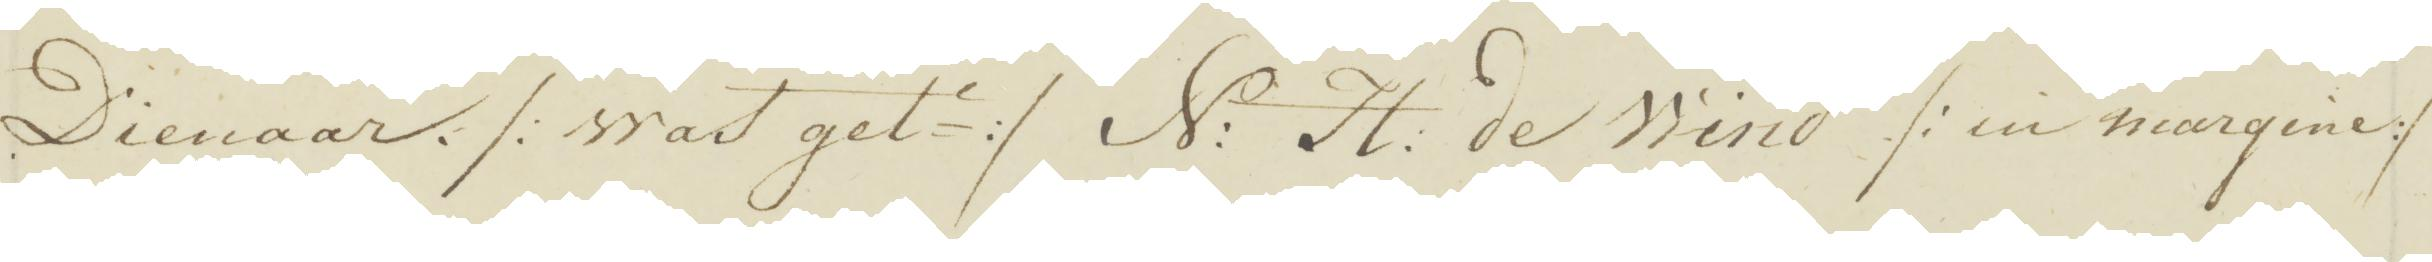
Dienaar. /:was get=e:/ N: H: de Wind /:in margine:/
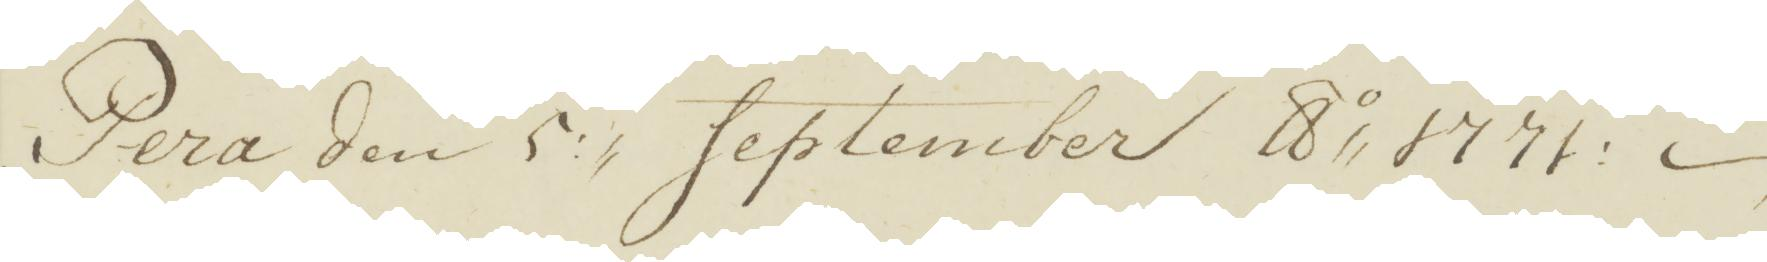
Pera den 5:„e september A„o 1771:
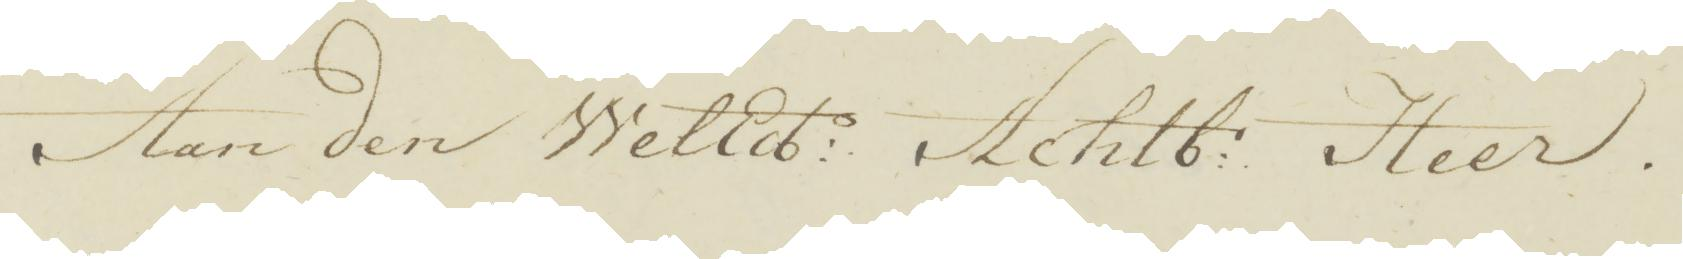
Aan den Wel Ed:s Achtb:r Heer.
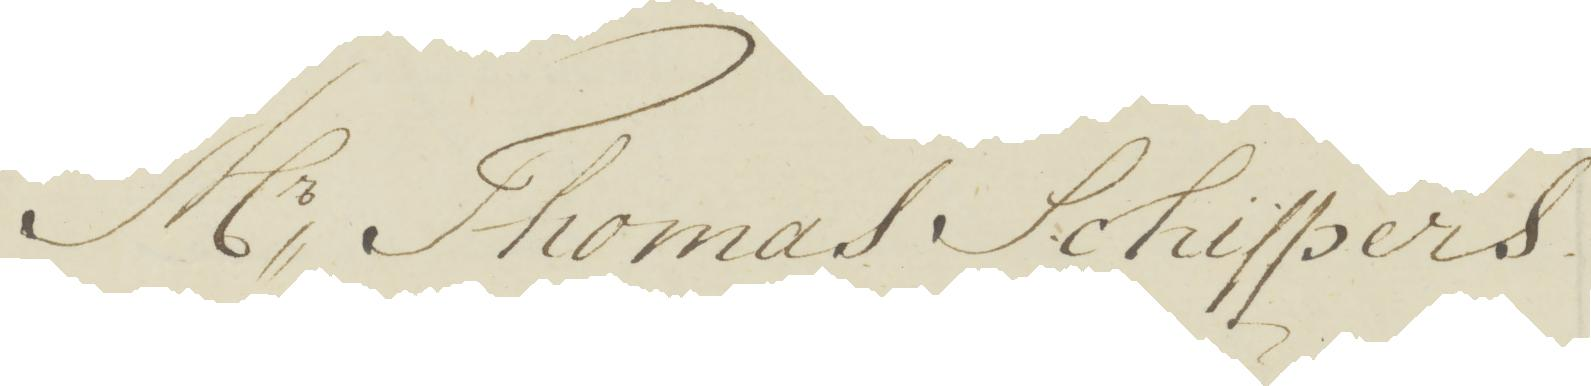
M„r Thomas schippers
